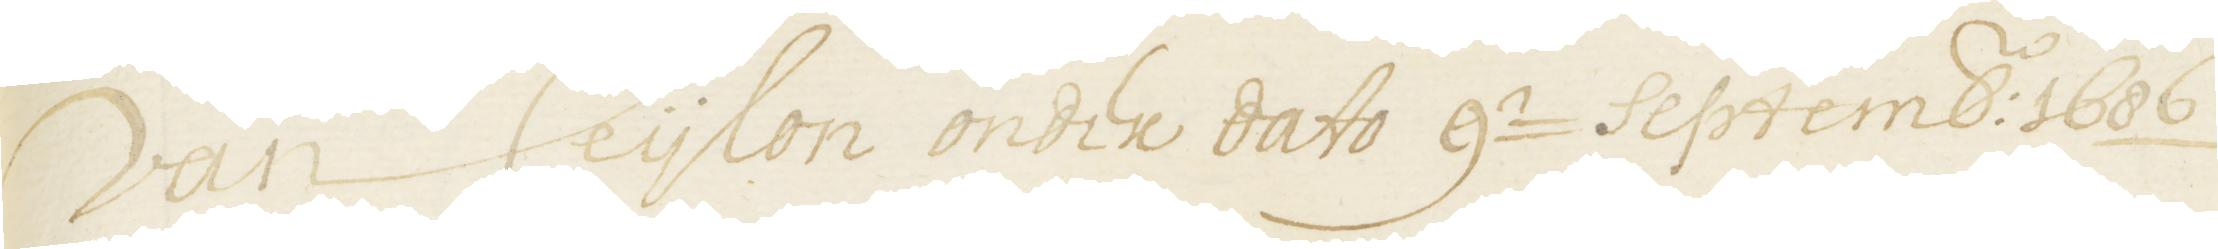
Van Ceijlon onder dato 9=' septemb:r 1686
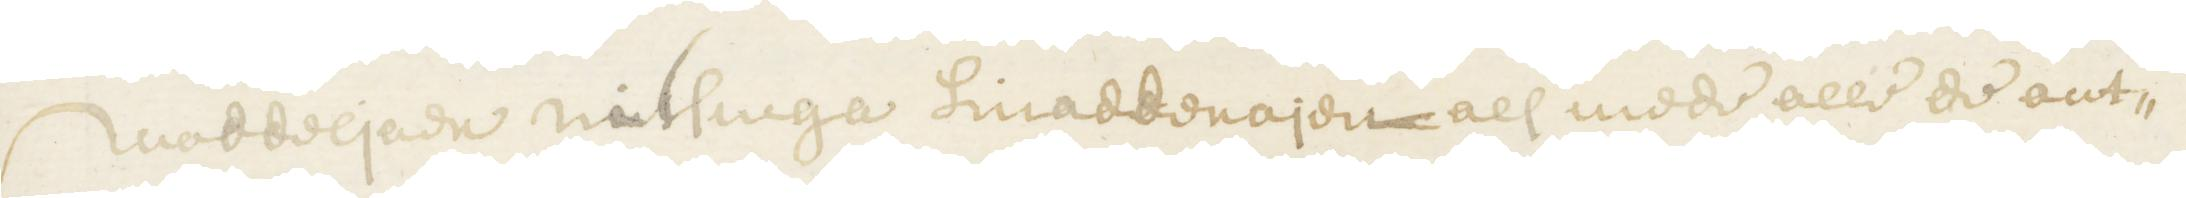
moddeljaer natsinga sinadderajen als mede alle de ont„
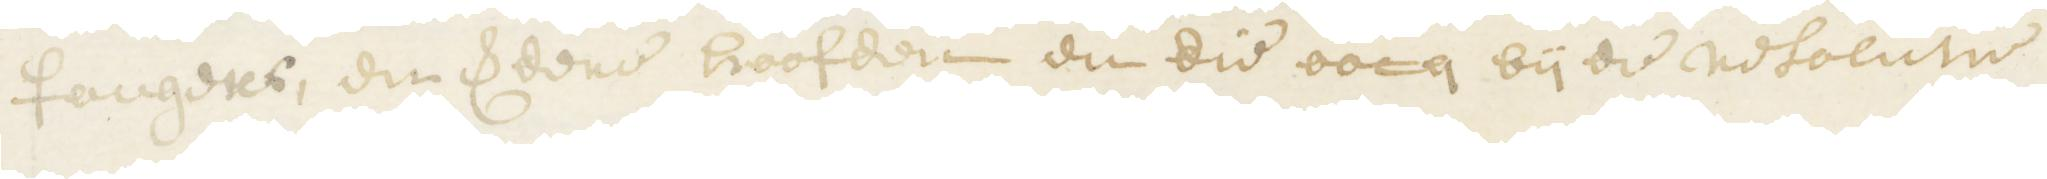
fangers, en verdere hoofden en die oocq bij de resolutie
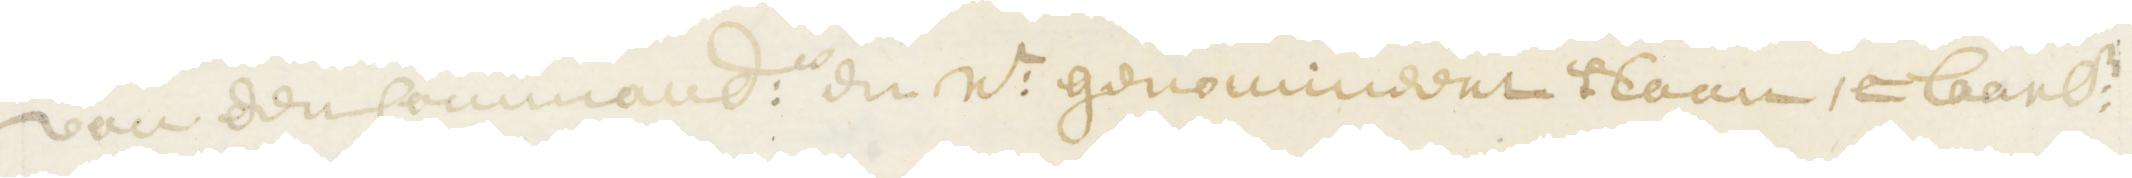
van den Command:r en r:t genomineert staan, claarlijk
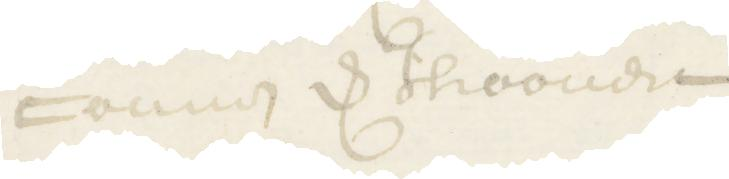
connen verthoonen
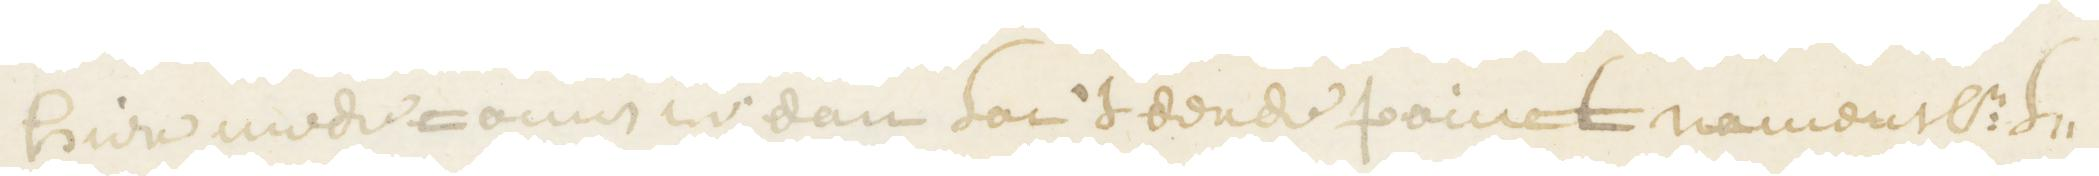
Hier mede comen we dan tot ’t derde poinct namentlijk te
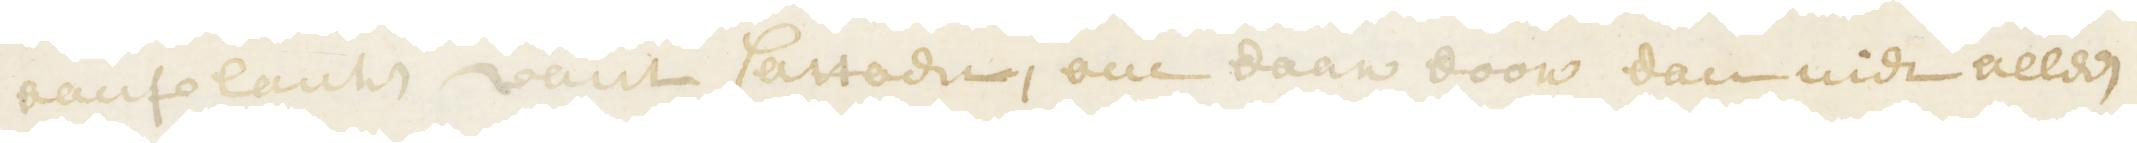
aanplanten vant Cattoen, om daar door dan niet alleen
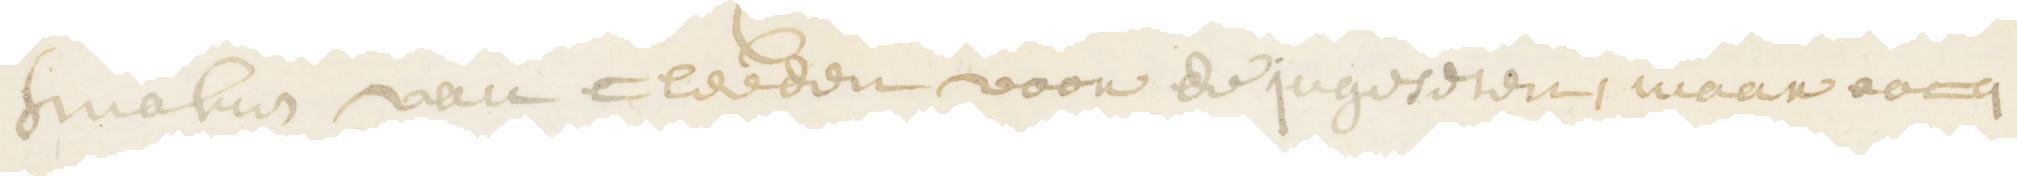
tmaken van cleeden voor de jngeseten, maar oocq
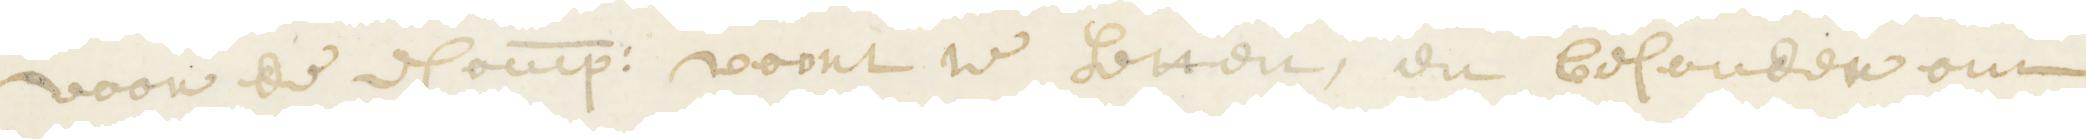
voor de eComp: voort te setten, en besonder om
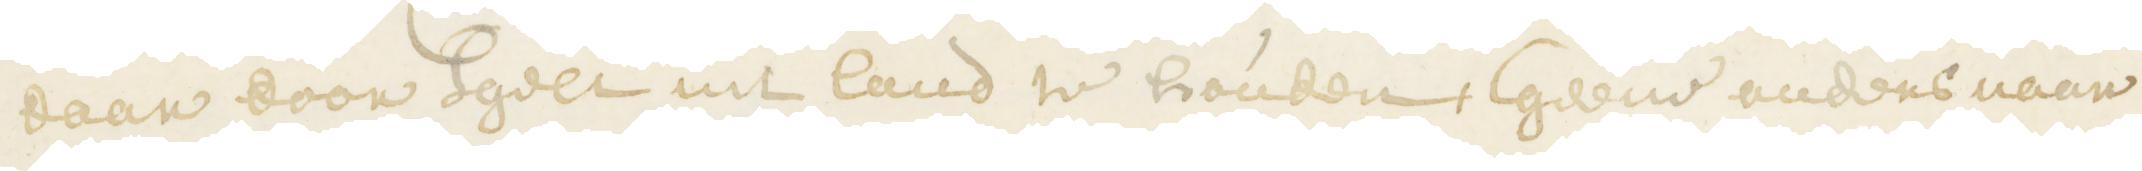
daar door tgelt int land te houden, tgeene anders naar
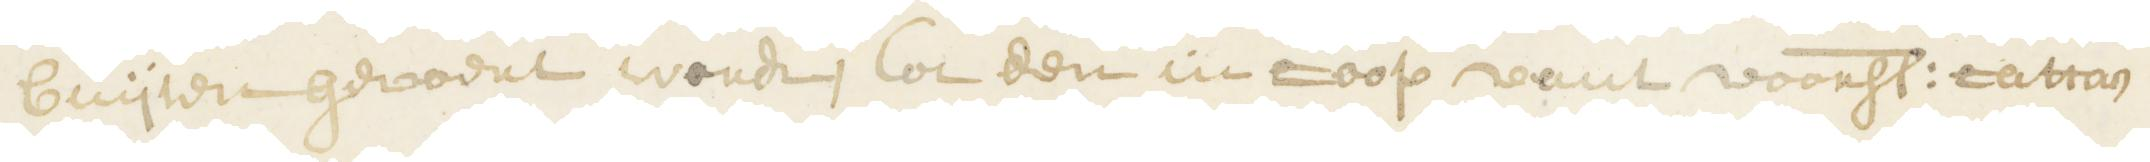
buijten gevoert worden, tot den in coop vant voorst: cattan
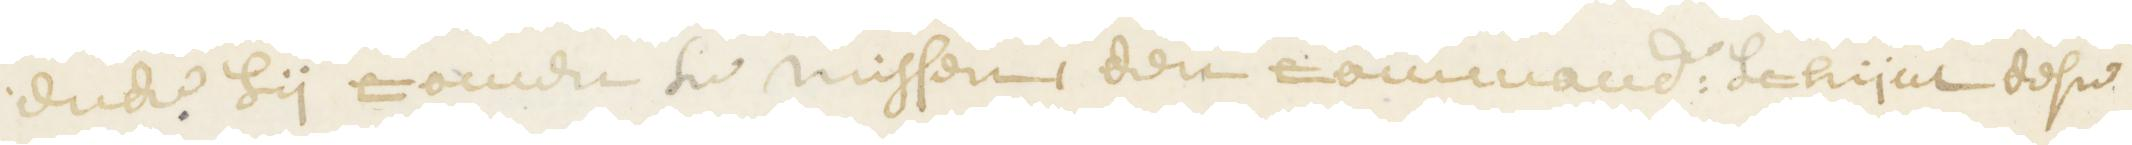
ende sij comen te missen, den command:t schijnt dese
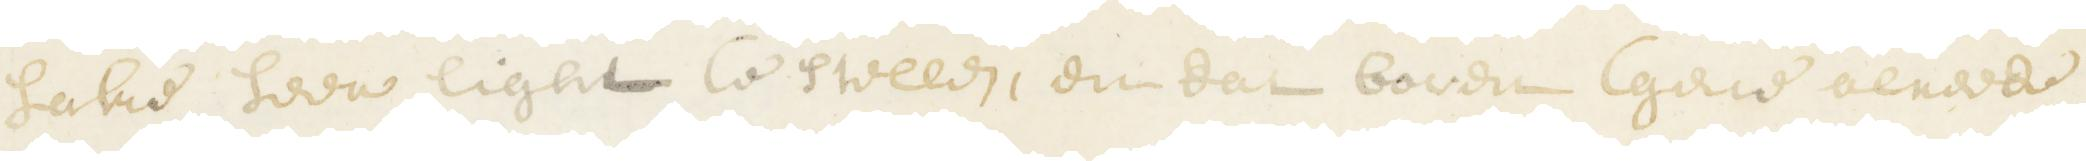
sake seer light te stellen, en dat boven tgene alreede
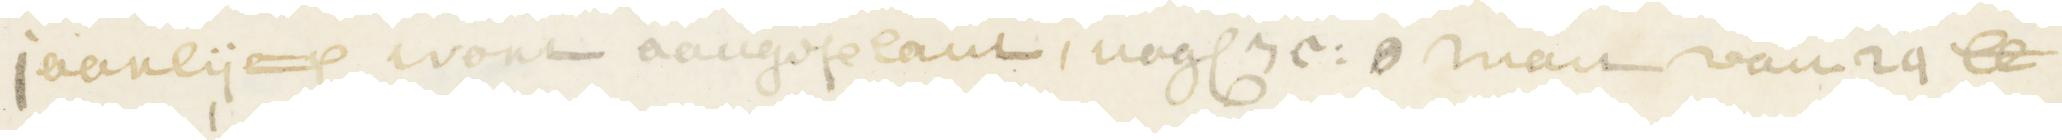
Jaarlijcx wort aangeplant, nogh 75: 8 man van 24 lb
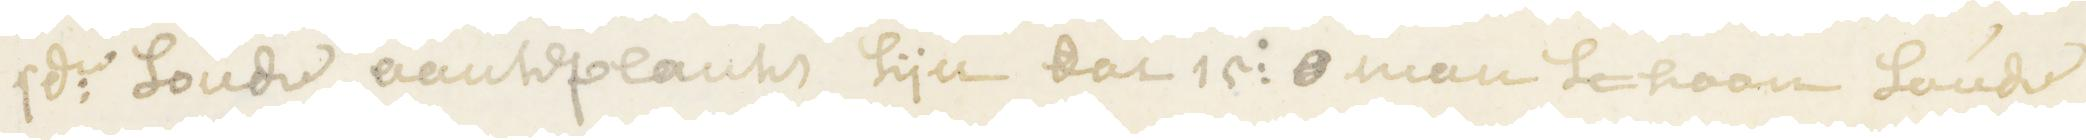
jd:s soude aanteplanten sijn dat 15: 8 man schoon soude
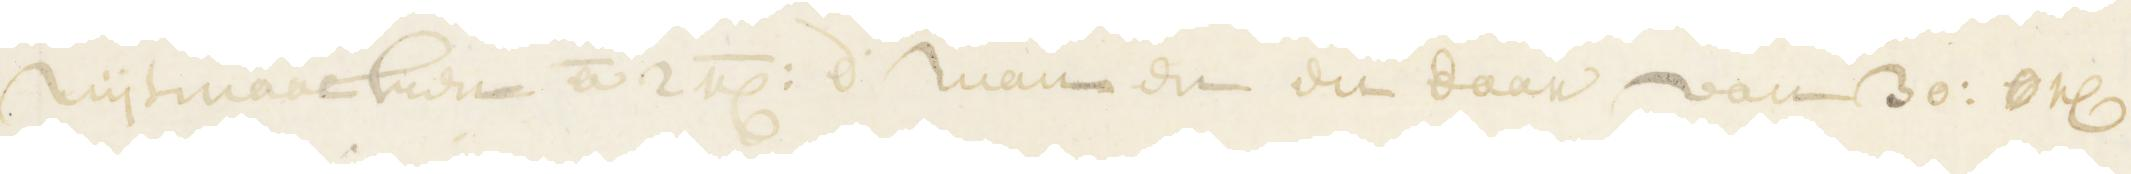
uijtmaacken a 2 rx: d' man en en daar van 30: rx
